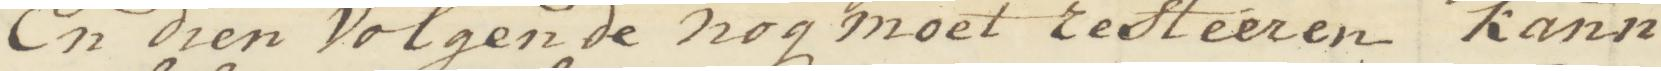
En dien volgende nog moet resteeren kann
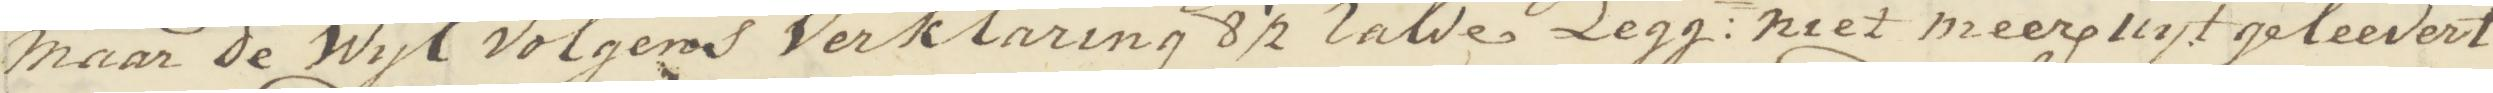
maar de wyl volgens verklaring 8½ halve Legg:rs niet meer uijt geleevert
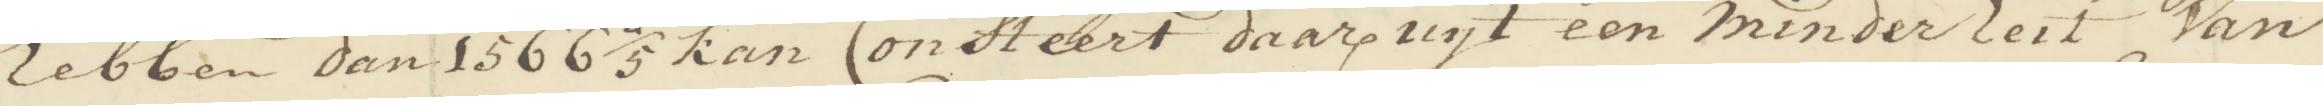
hebben dan 1566 4/5 kan consteert daar uijt een minderheit van
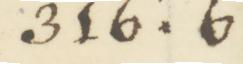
316. 6
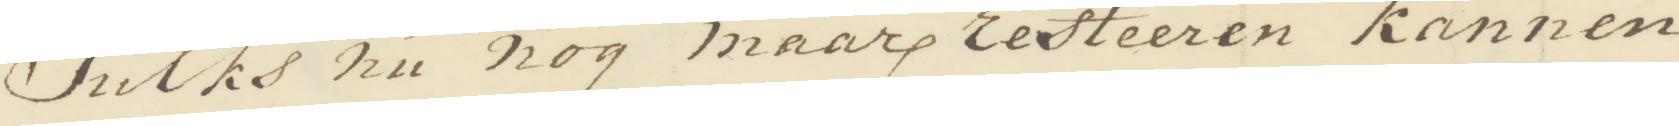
Sulks nu nog maar resteeren kannen
